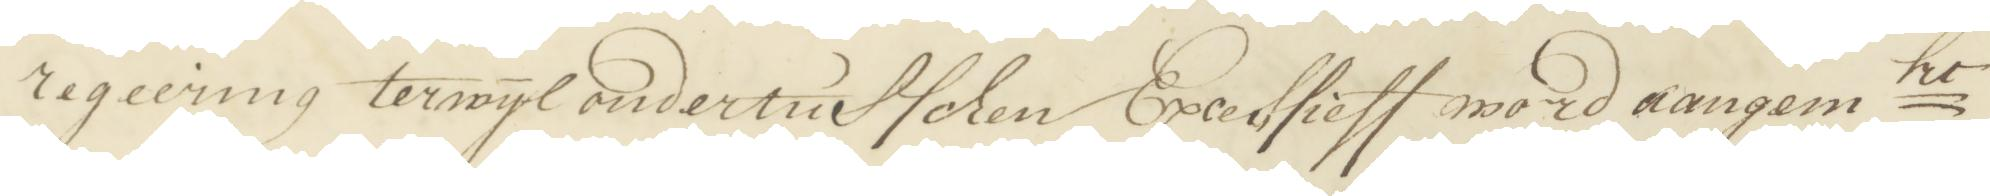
regeering terwijl ondertusschen Excessieff word aangem:kt
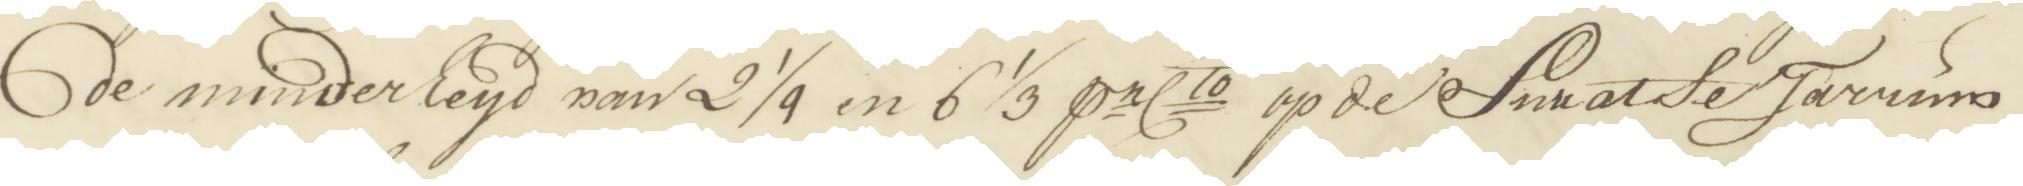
de minderheyd van 2¼ in 6 1/3 p=r C=to op de Suratse Jarruw
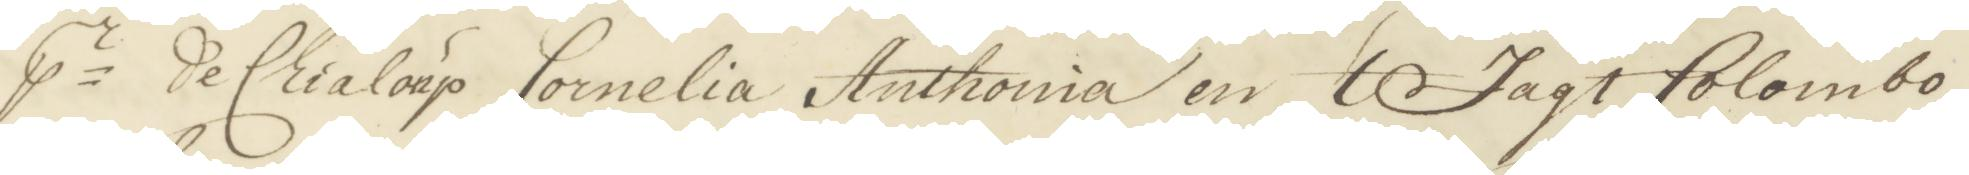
p=r de Chialoup Cornelia Anthonia en ’t Jagt Colombo
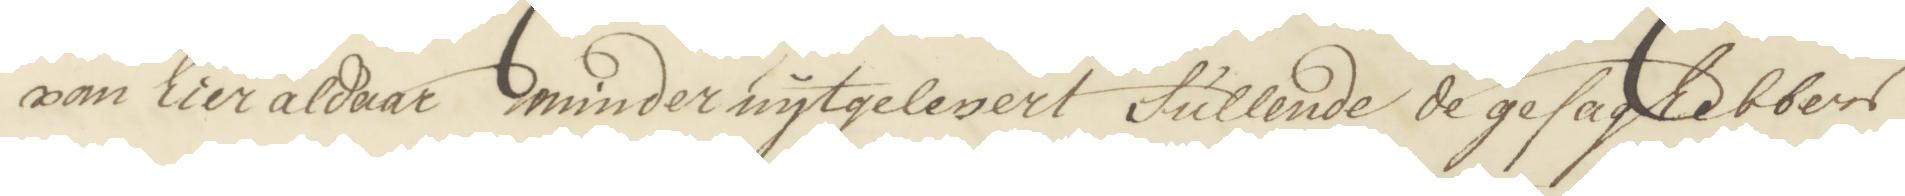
van hier aldaar minder uijtgelevert sullende de gesaghebber
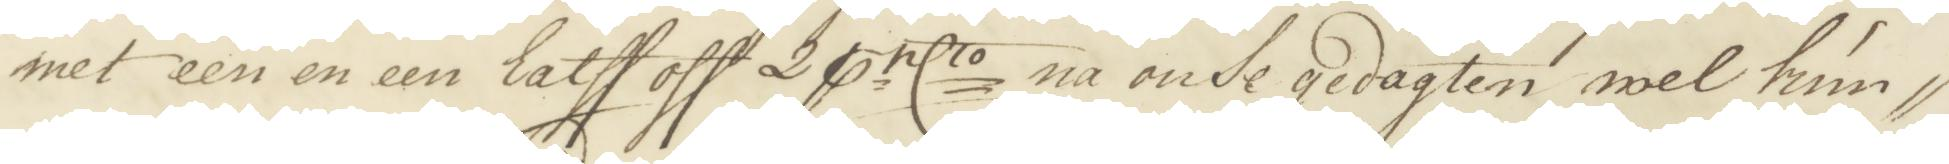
met een en een halff off 2 p=r C=to na onse gedagten wel kun„
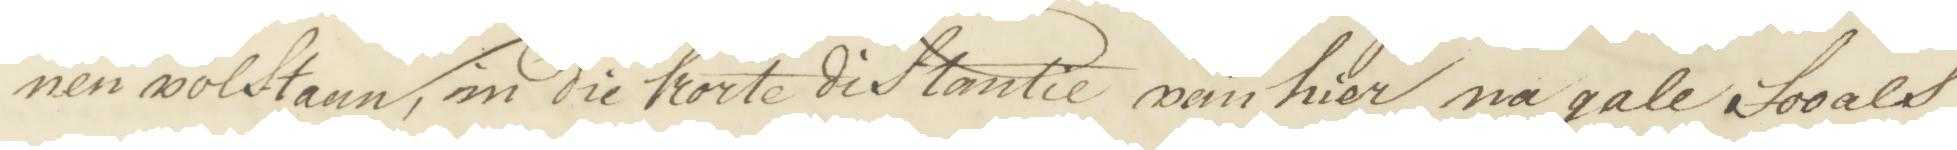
nen volstaan, in die korte distantie van hier na gale soo als
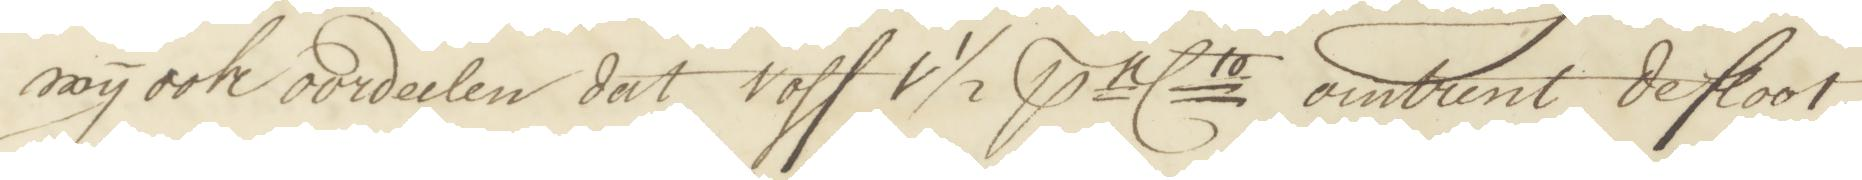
wij ook oordeelen dat 1 off 1½ p=r C=to omtrent de sloot
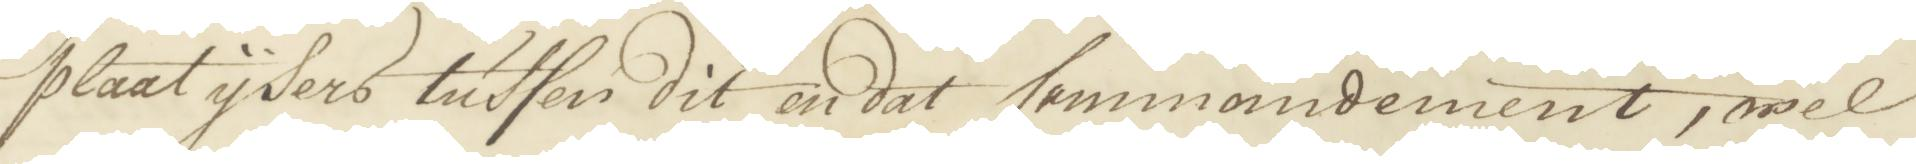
plaatijsers tussen dit en dat Commandement, wel
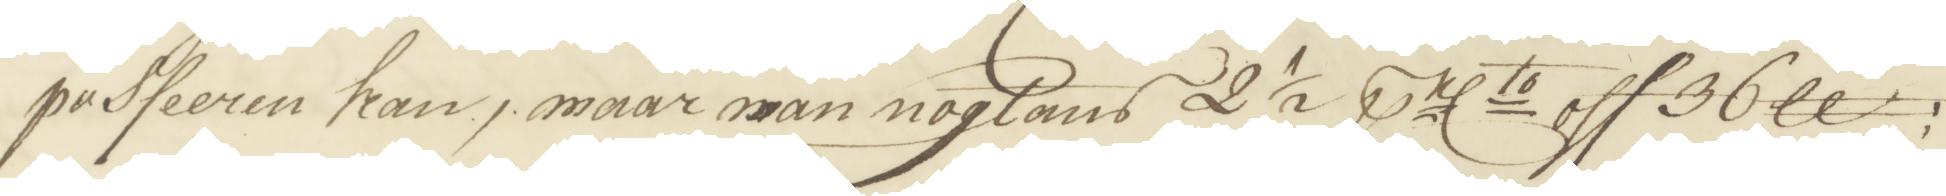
passeeren kan, waar van nogtans 2½ p=r C=to off 36 lb:
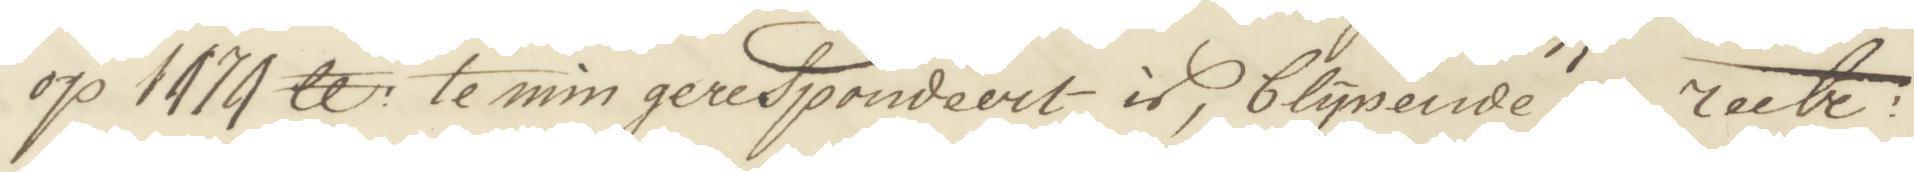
op 1474 lb: te min gerespondeert is, blijvende op reek:
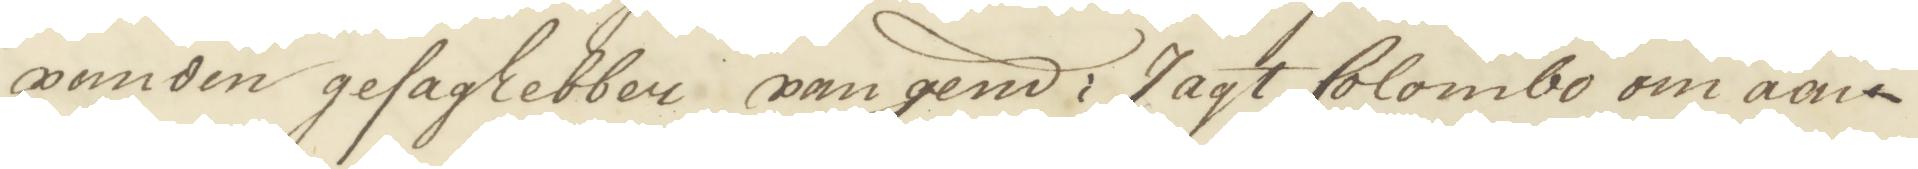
vanden gesaghebber van gem: Jagt Colombo om aan
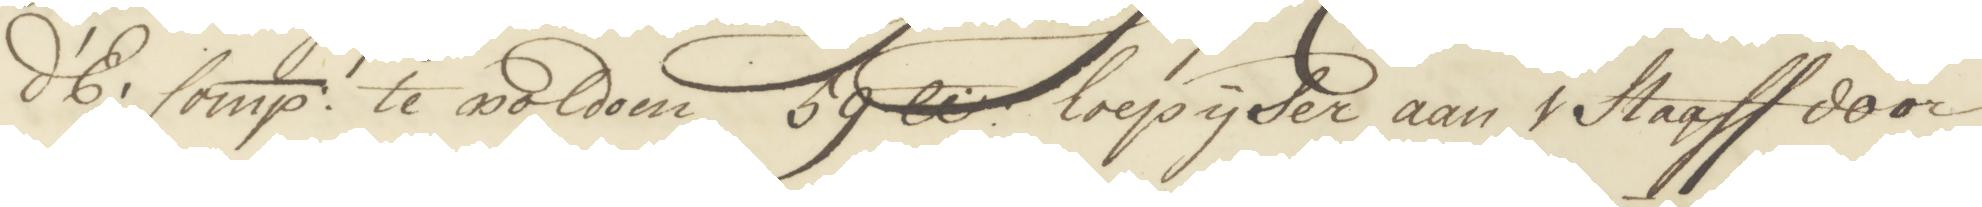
d’E: Comp: te voldoen 59 lb: hoepijser aan 1 staaff door
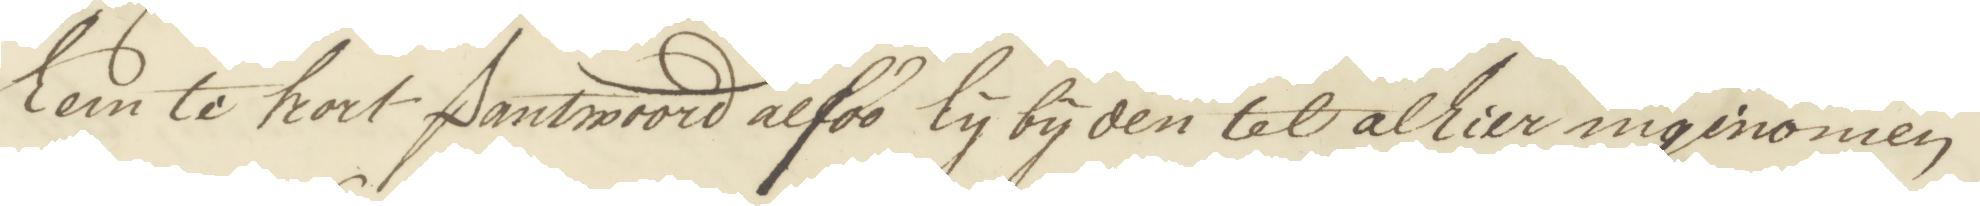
hem te kort verantwoord alsoo hij bij den tel alhier ingenomen
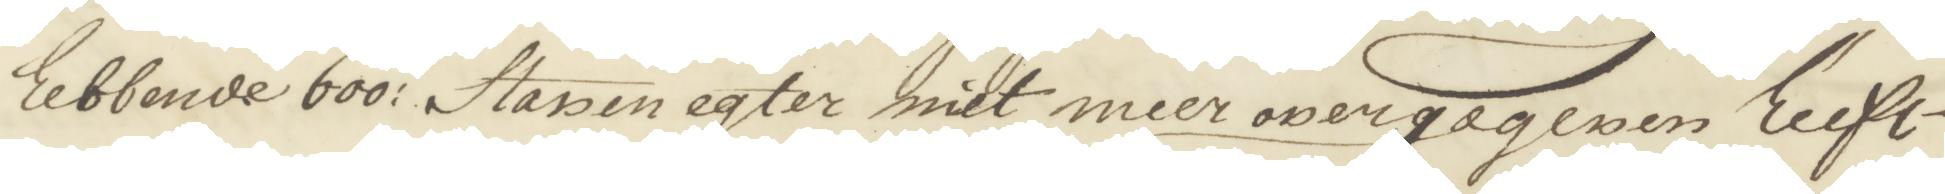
hebbende 600: staven egter niet meer overgegeven heeft
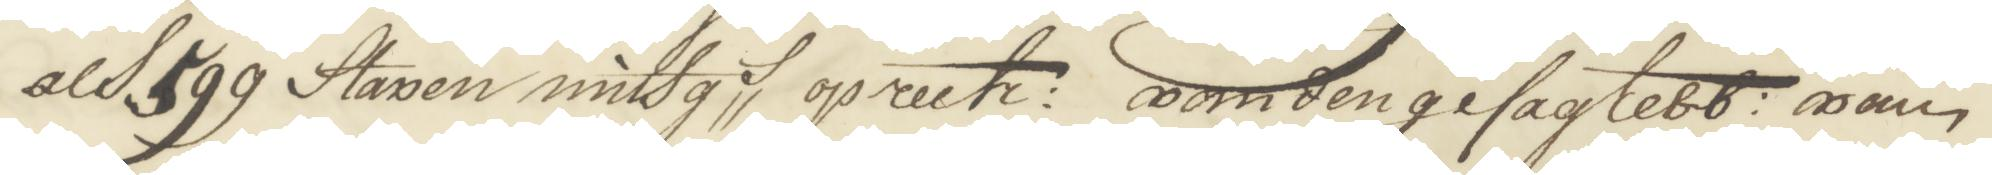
als 599 staven mitsg:s op reek: van den gesaghebb: van
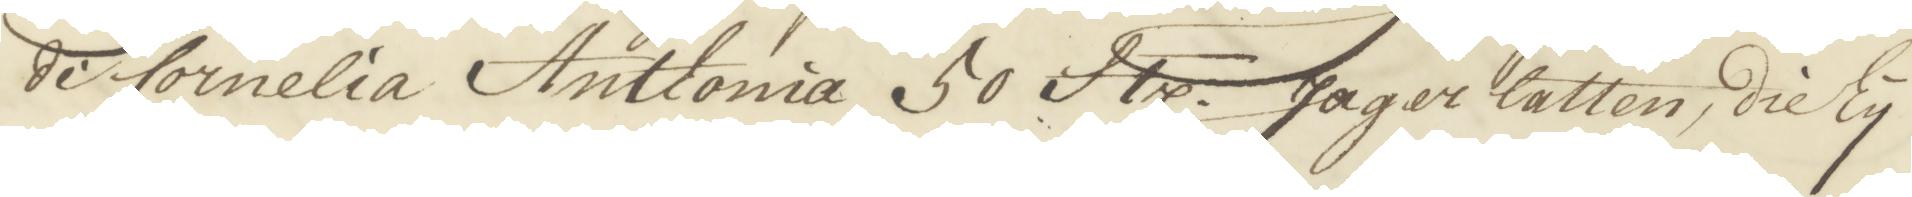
de Cornelia Anthonia 50 stx. Jager latten, die hij
